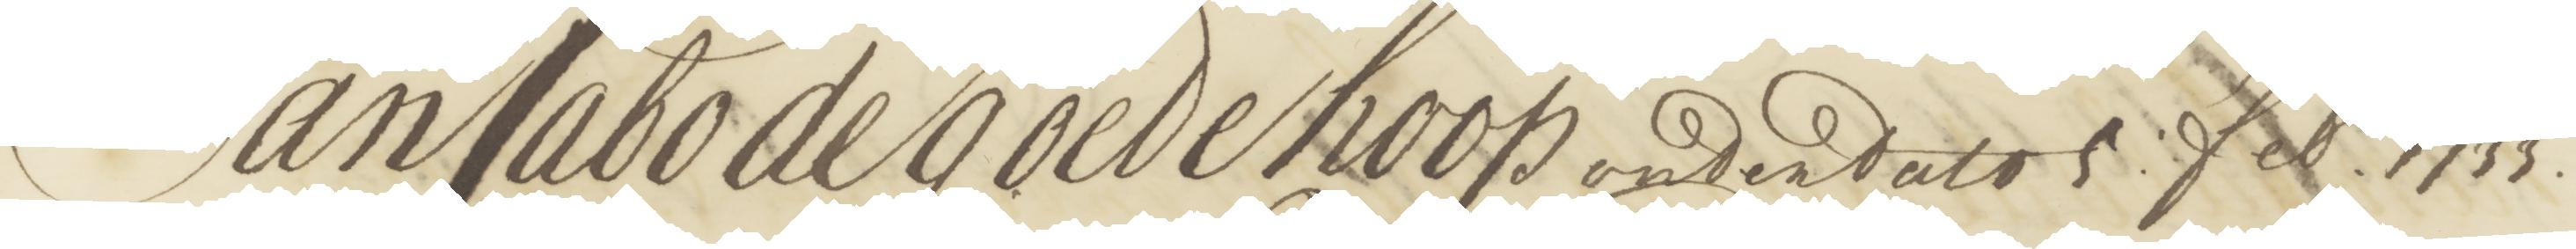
Van Cabo de goede hoop onder dato 5:' feb: 1733.
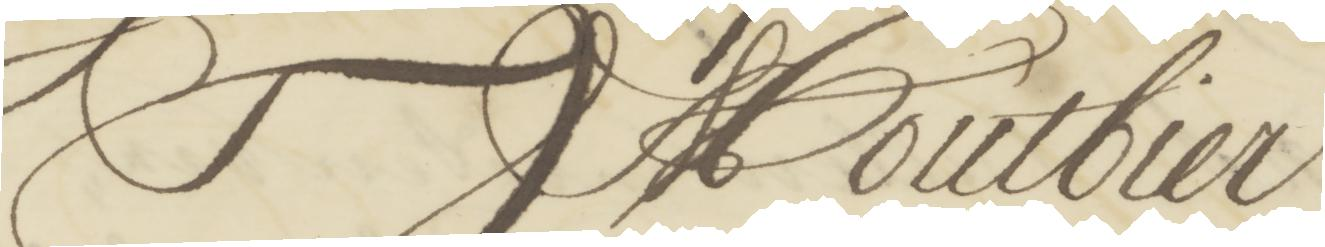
T Moutbier
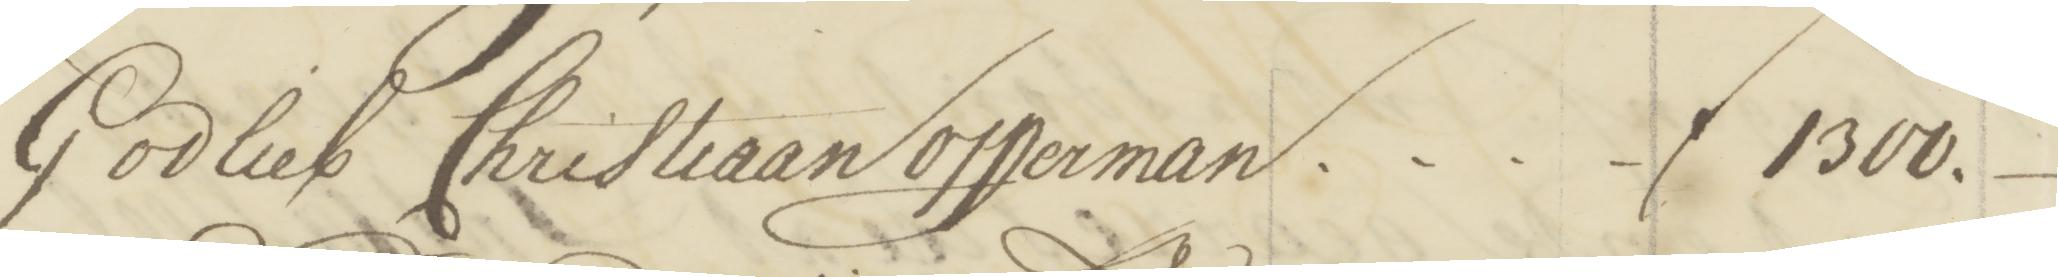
Godlieb Christiaan opperman . . . - ƒ 1300. —
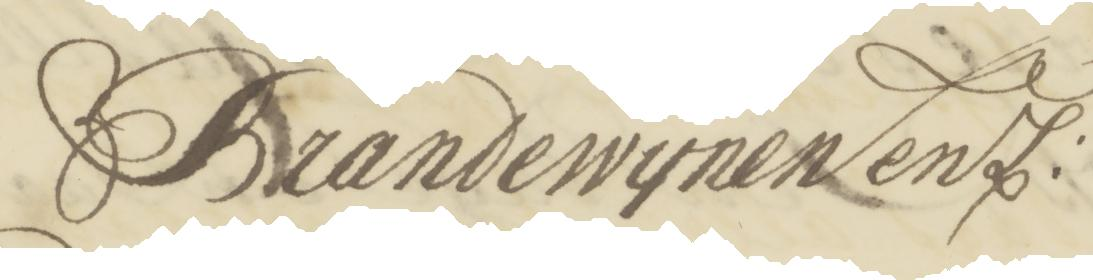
Brandewijnen enz:
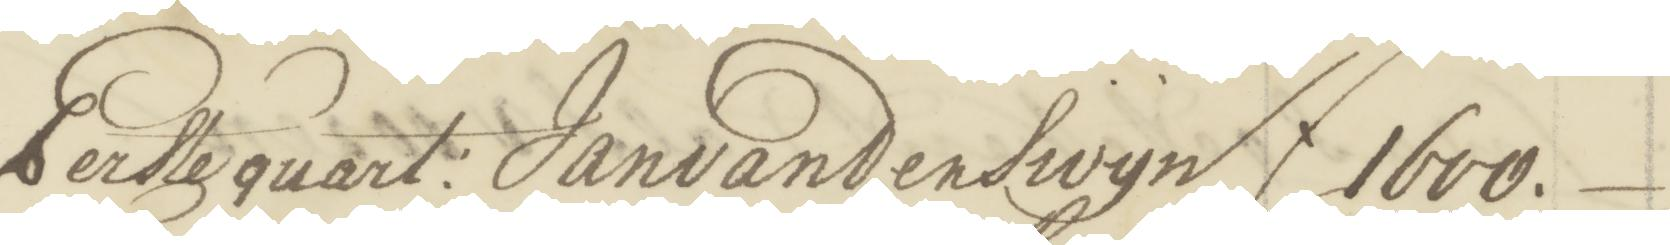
Eerste quart: Ian vander swijn ƒ 1600. —
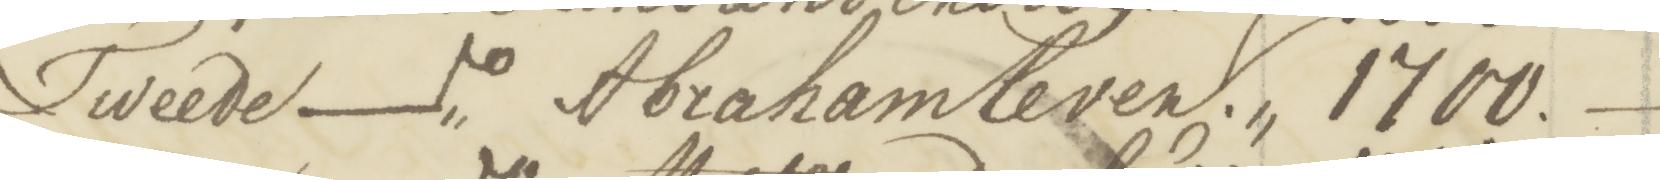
Tweede _„o Abraham lever . „ 1700. —
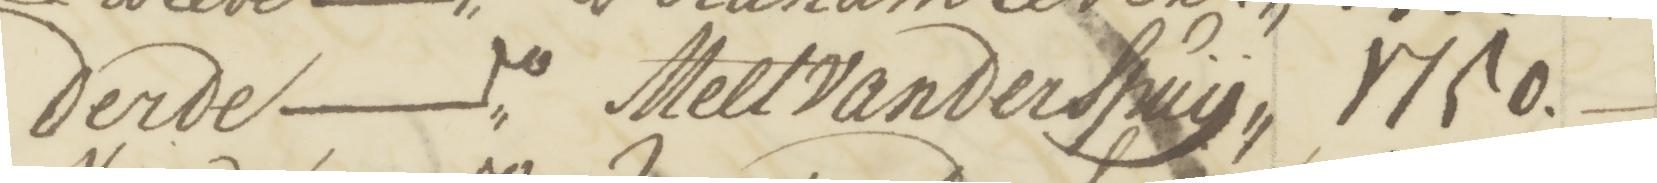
derde _„o Melt vander spuij „ 1750. —
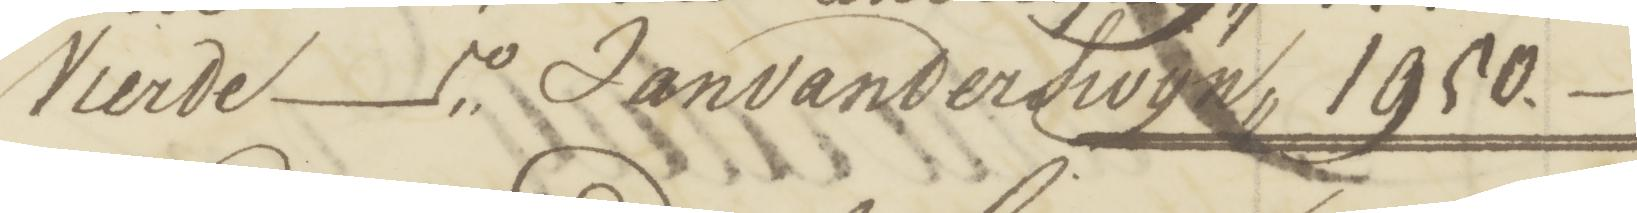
vierde _„o Ian vander swijn „ 1950. —
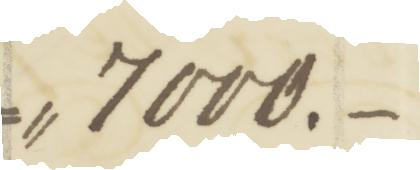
„ 7000. —
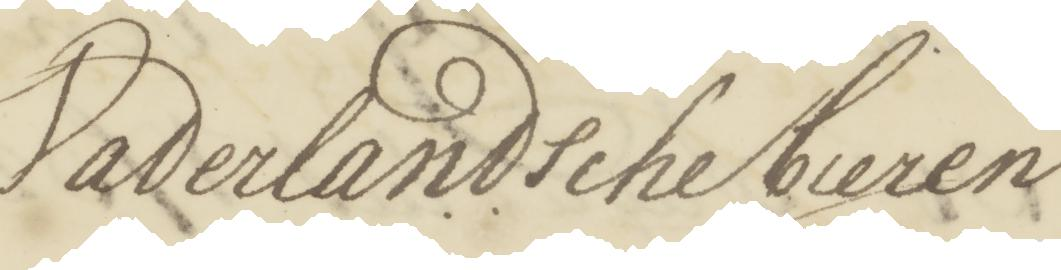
Vaderlandsche bieren
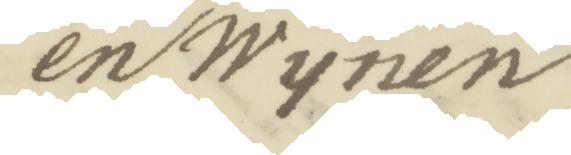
en wijnen
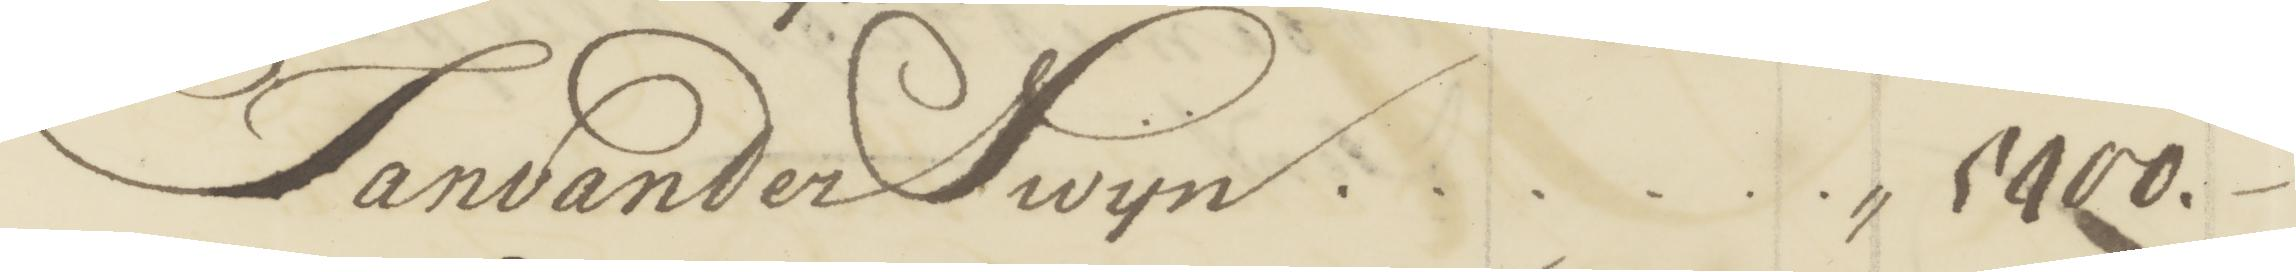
Ian vander Swijn . . . - . . „ 5400. —
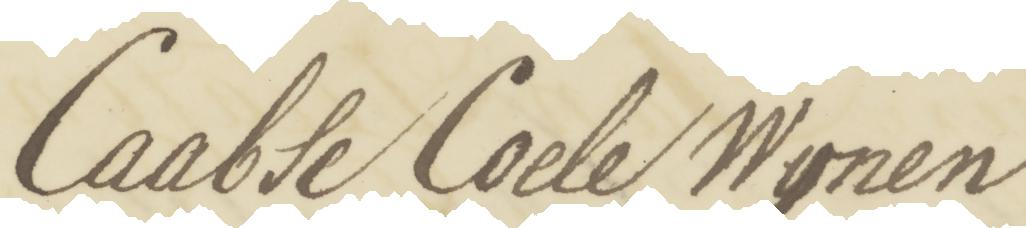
Caabse Coele Wijnen
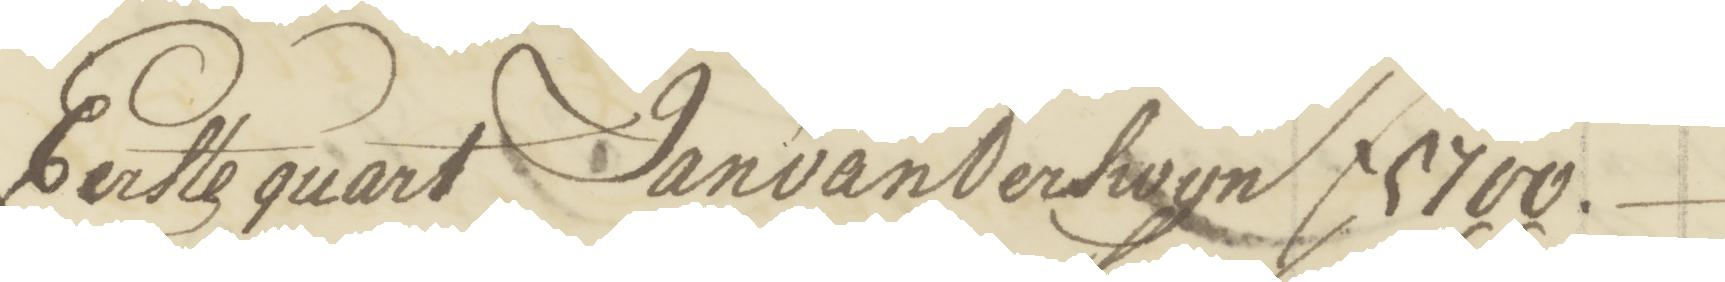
Eerste quart Ian van der swijn ƒ5700. —
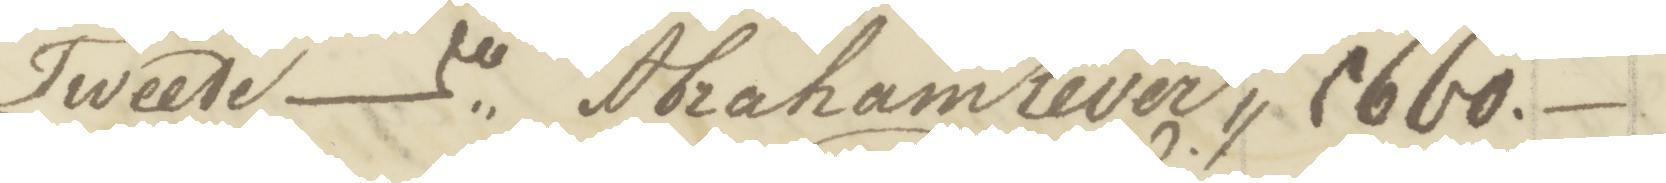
Tweede _„o Abraham lever „ 5660. —
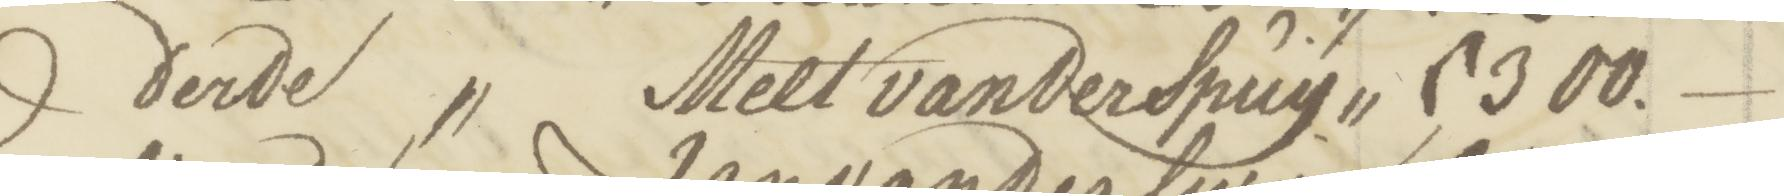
derde „ Melt vander spuij „ 5300. —
